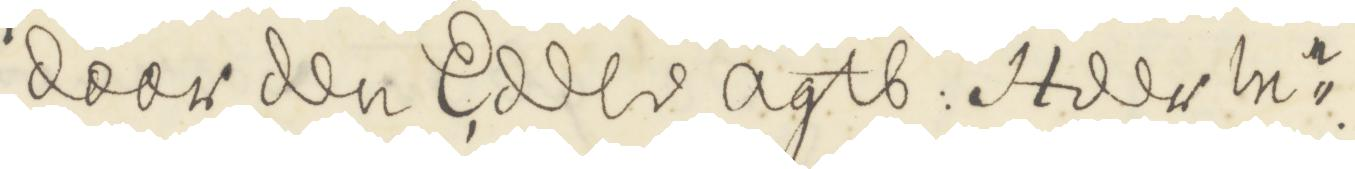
door den Edele agtb: Heer M„r
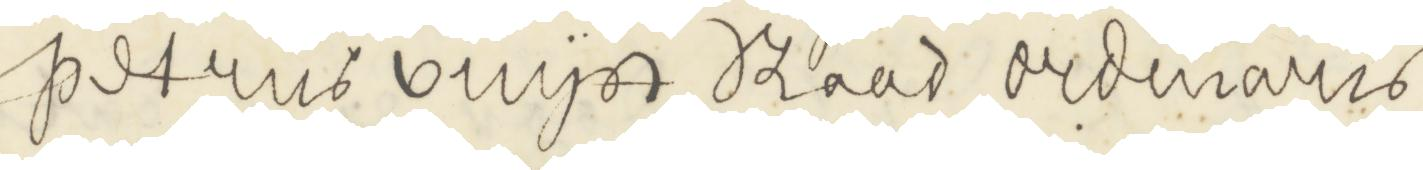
petrus vuijst Raad ordinaris
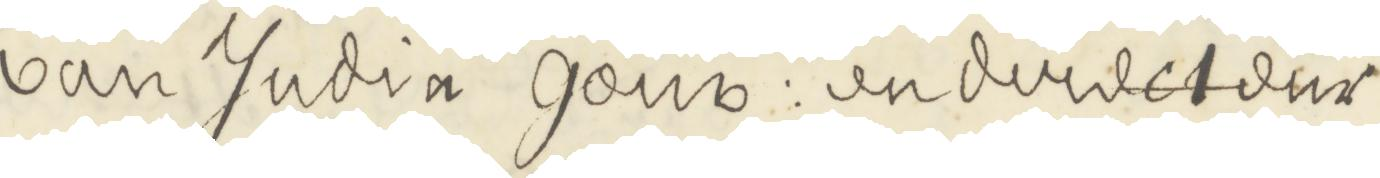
van Jndia gouv:r en directeur
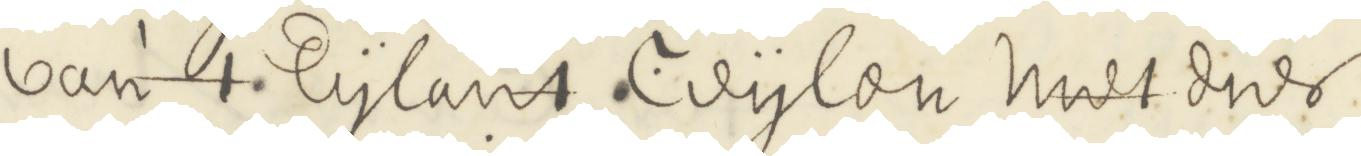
van ’t Eijlant Ceijlon met dies
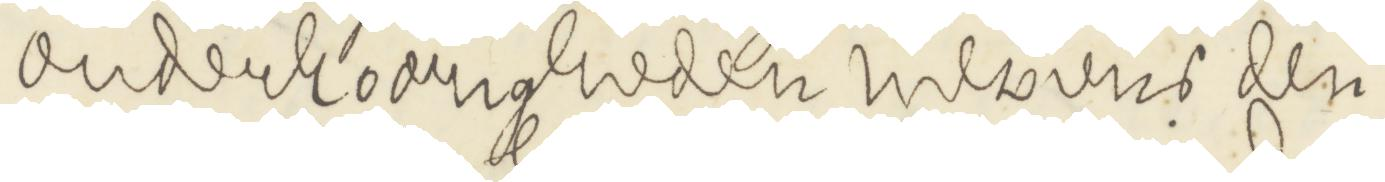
onderhoorigheden nevens den
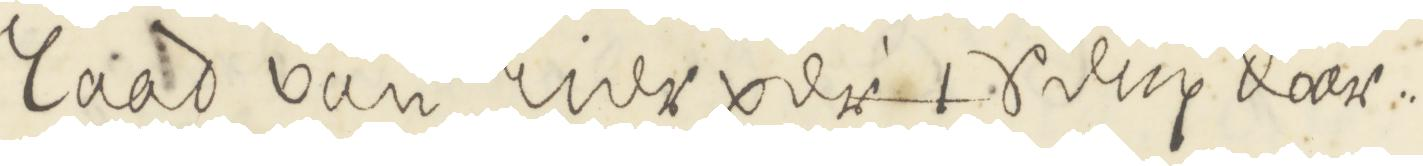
raad van hier per 't schip door„
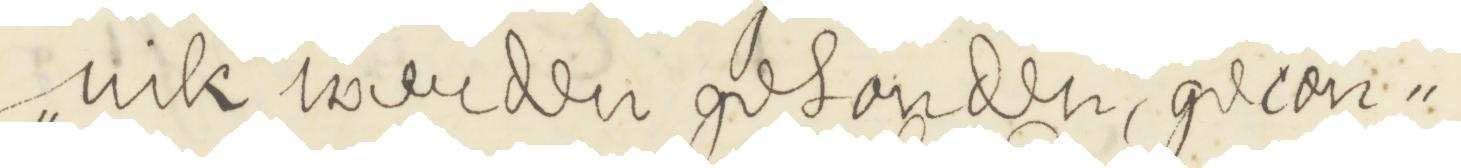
nik werden gesonden, gecon„
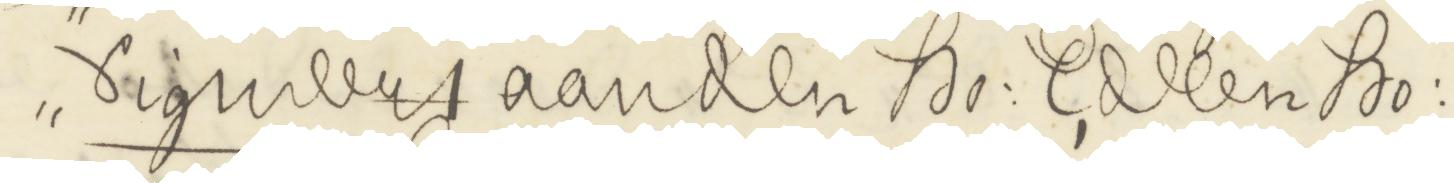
„signeert aan den Ho: Edelen Ho:
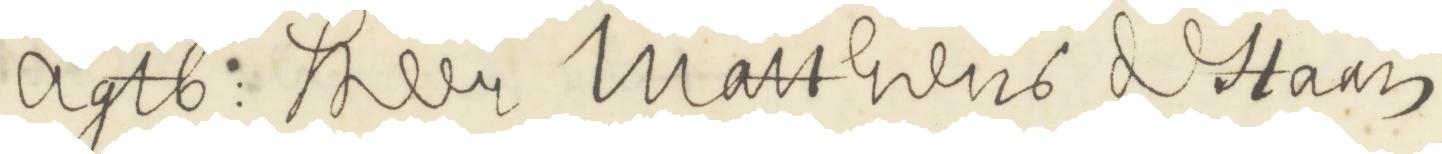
Agtb: Heer Mattheus de Haan
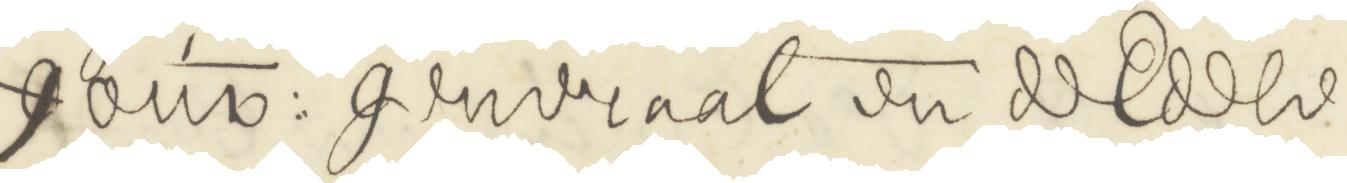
gouv: generaal en de Edele
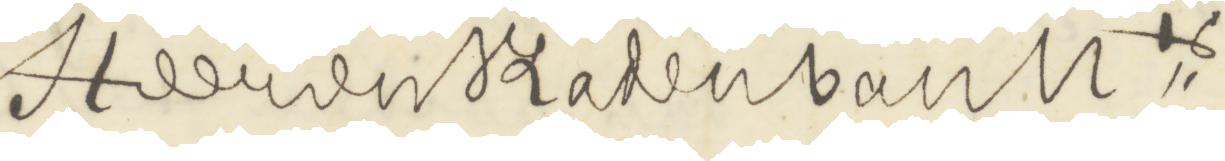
Heeren Raden van N„ts
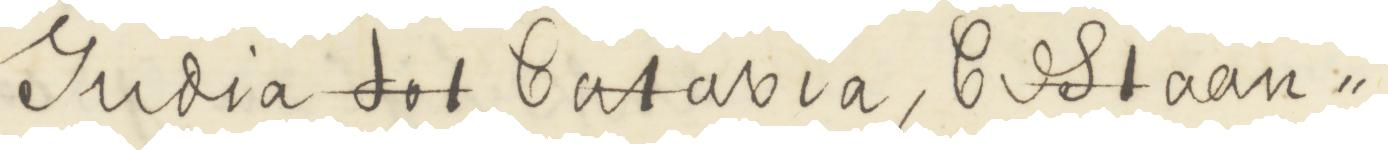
India tot batavia, bestaan„
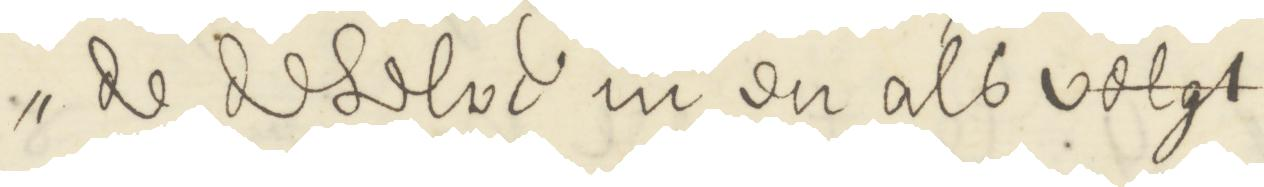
„de deselve in en als volgt
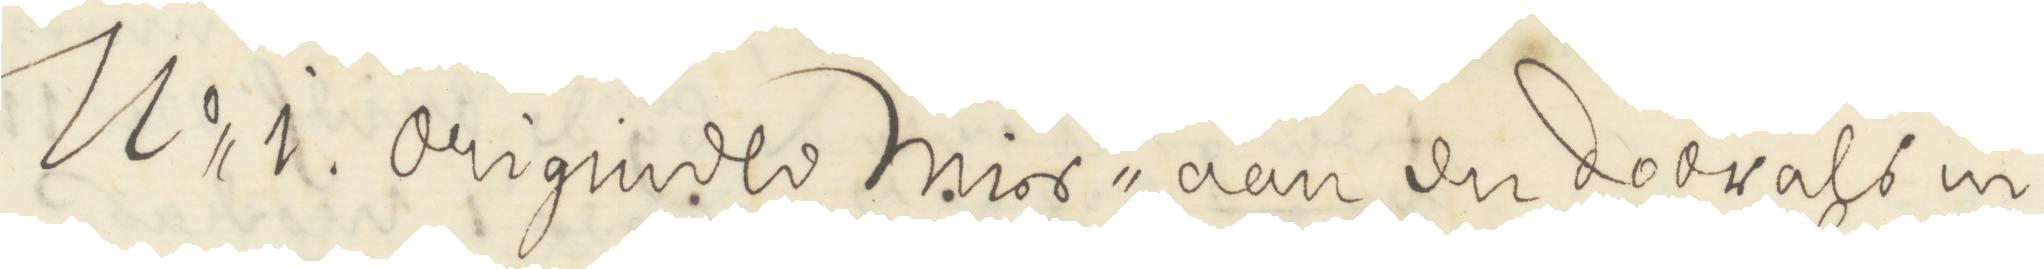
N„o 1. Originele Miss„e aan en door als in
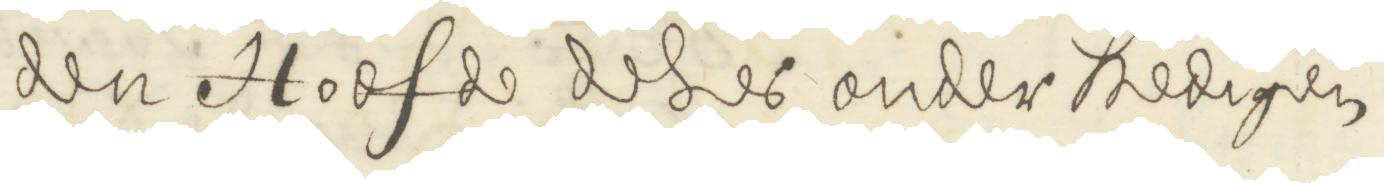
den Hoofde deses onder hedigen
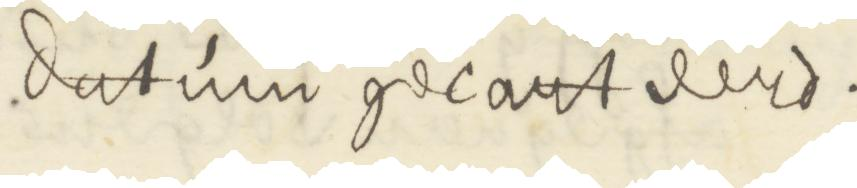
datum gecarteerd.
